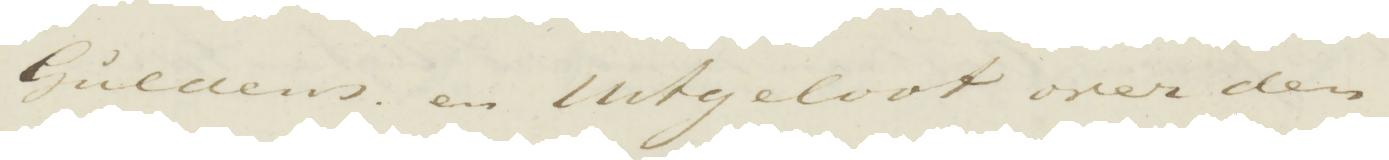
Guldens, en uitgeloot over den
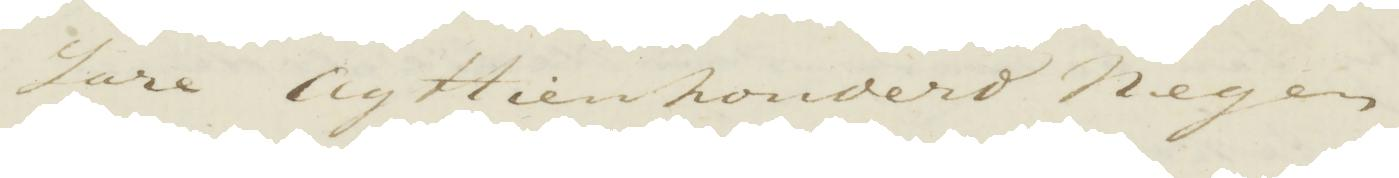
Iare Agttienhonderd Negen
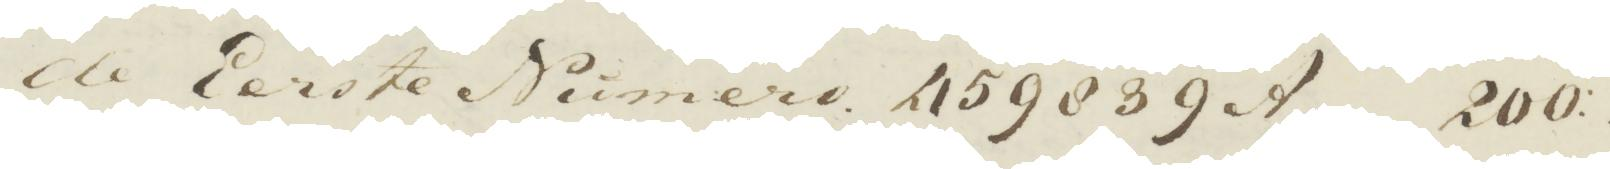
de Eerste Numero. 459839 A.„ 200:
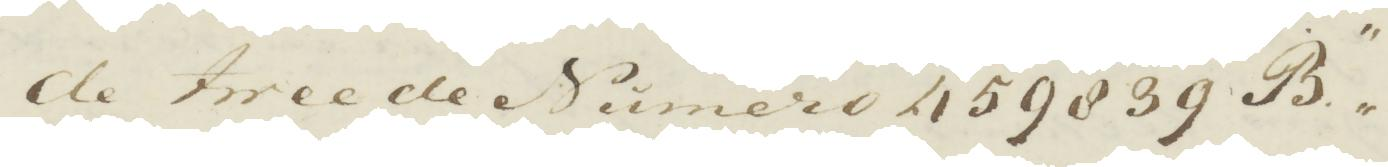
de tweede Numero 459839 B.„
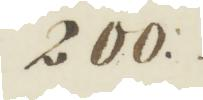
200:
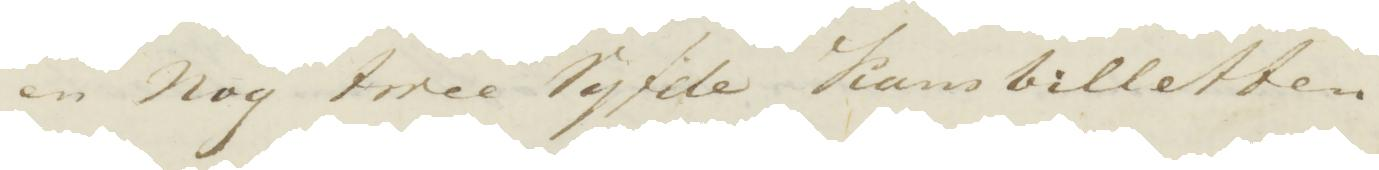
en nog twee Vyfde kansbilletten
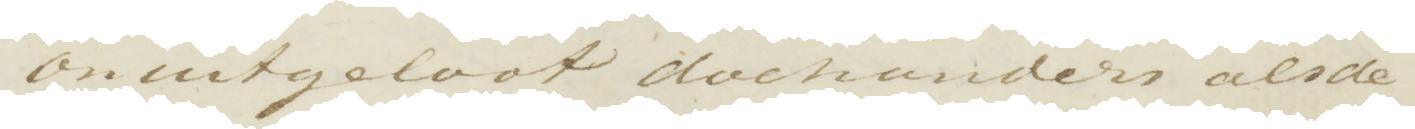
on uitgeloot doch anders als de
